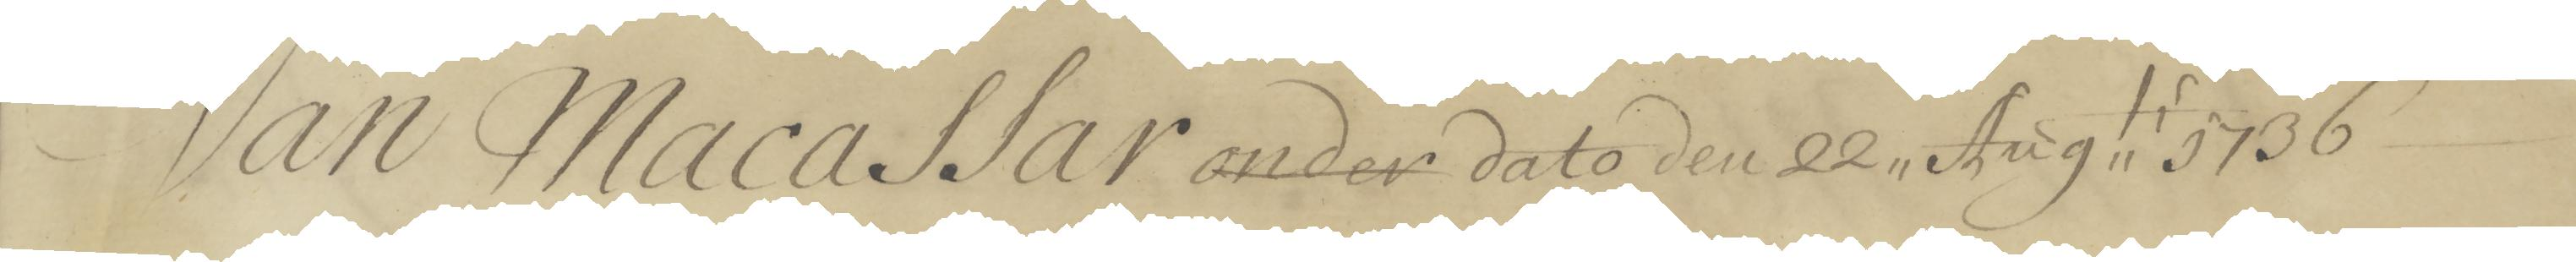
Van Macassar onder dato den 22„ Aug„ti 1736 —
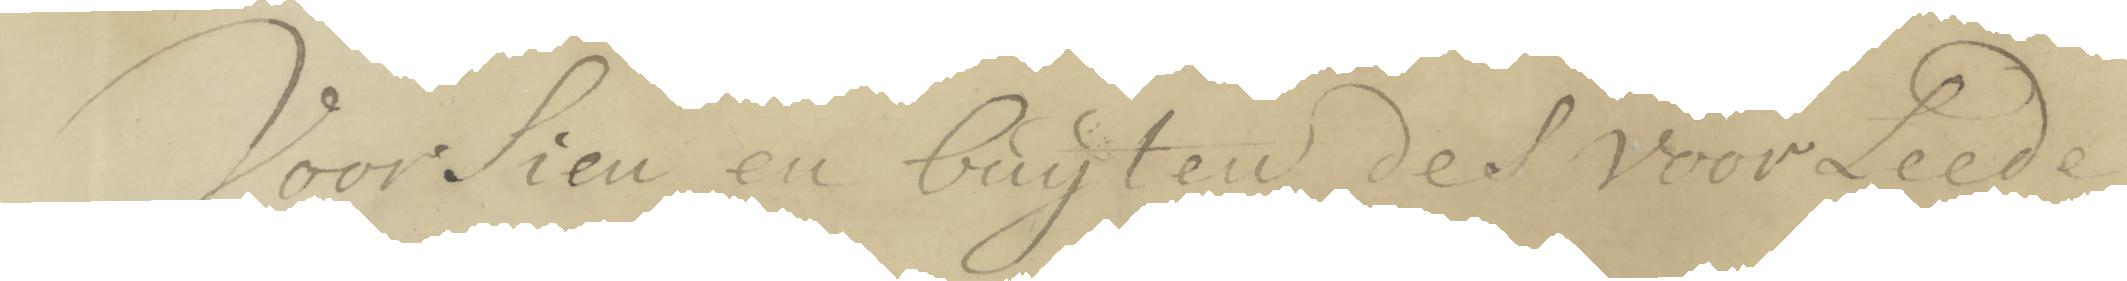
Voor sien en buijten des voor leede
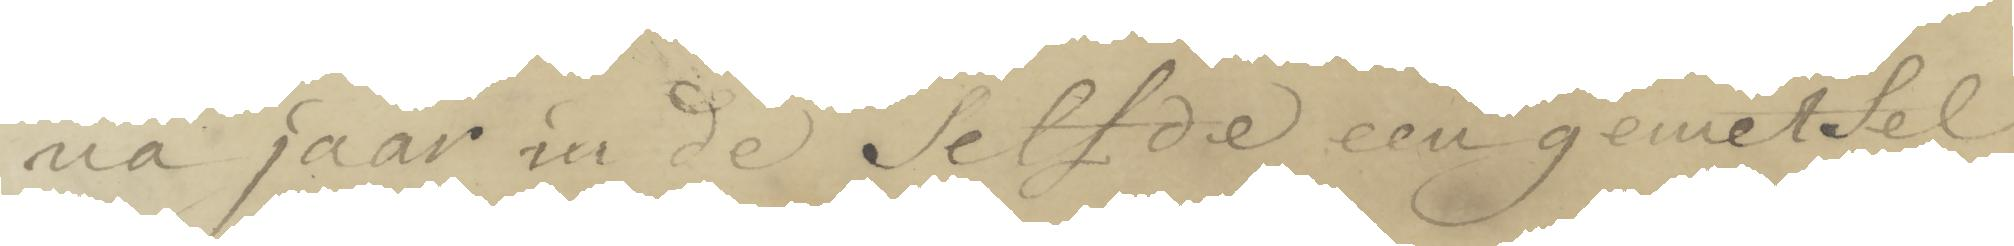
na jaar in de selfde een gemetsel
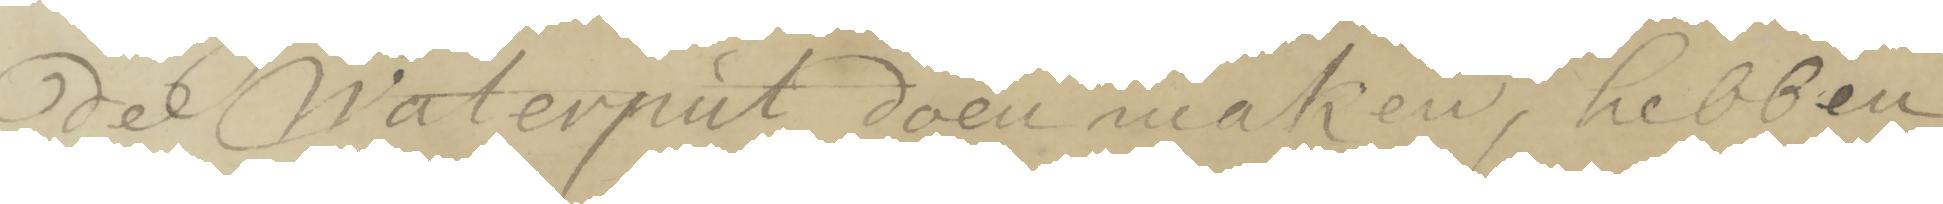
de waterput doen maken, hebben
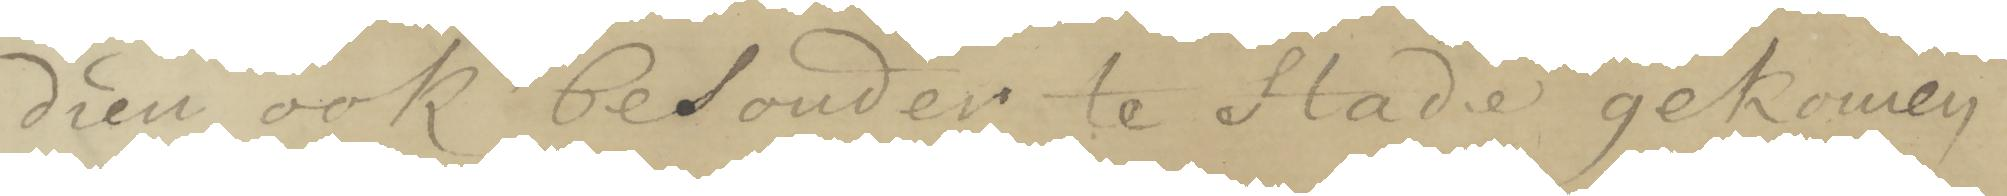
dien ook besonder te stade gekomen
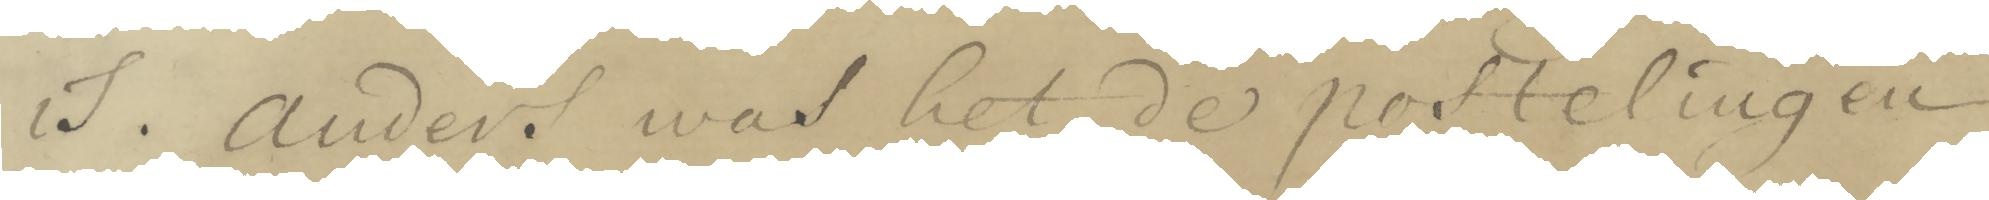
is. anders was het de postelingen
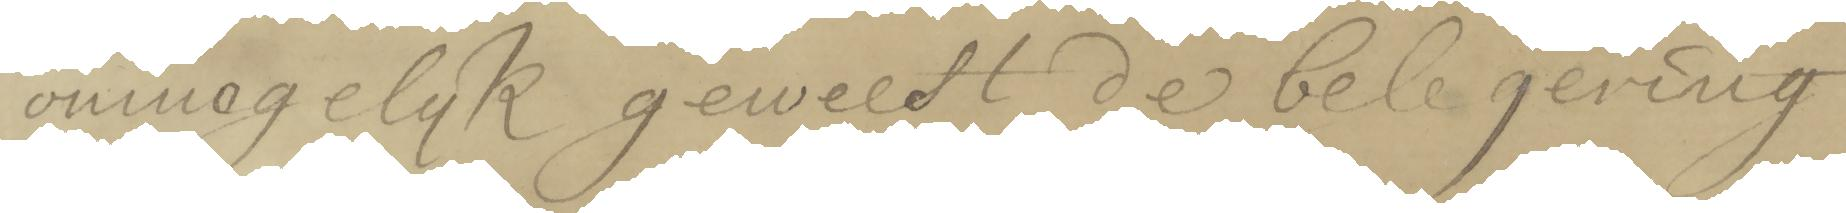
onmogelijk geweest de belegering
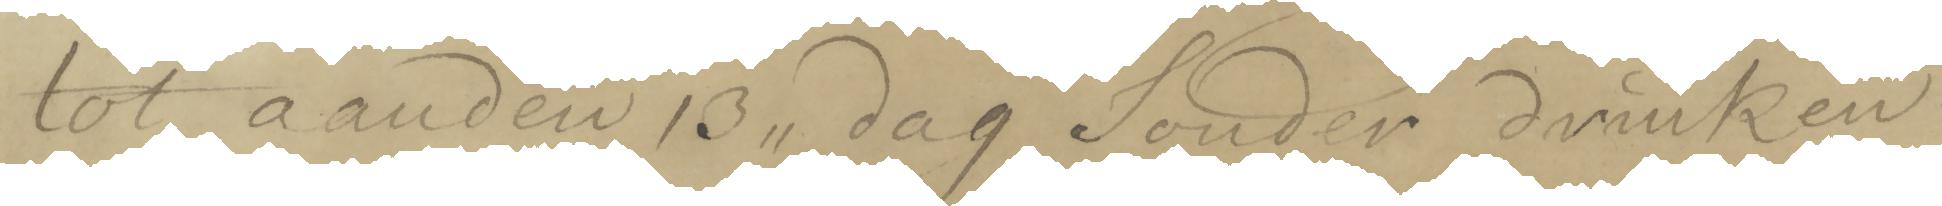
tot aan den 13„ dag sonder drinken
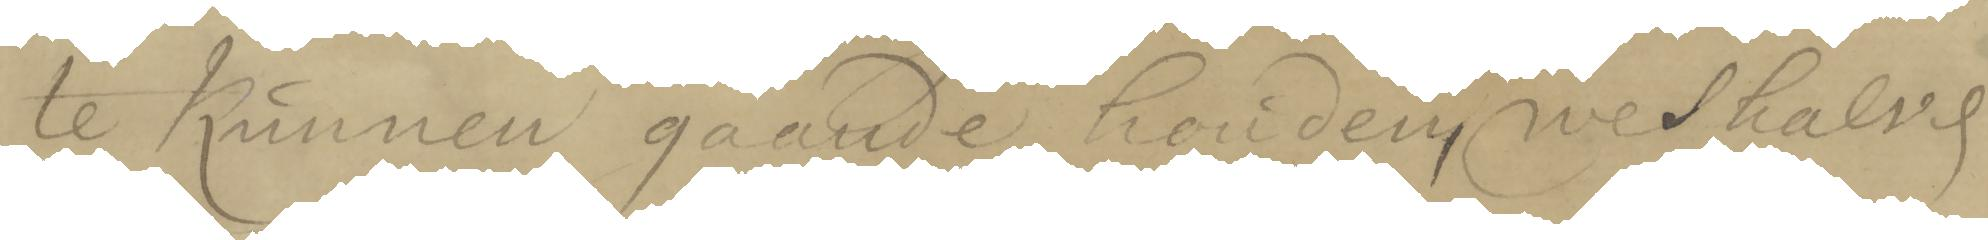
te kunnen gaande houden, weshalven
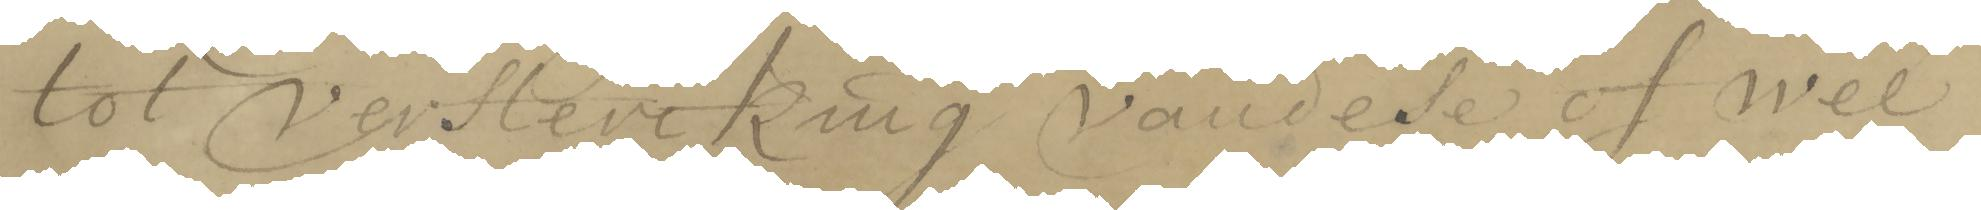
tot verstercking vandese of wel
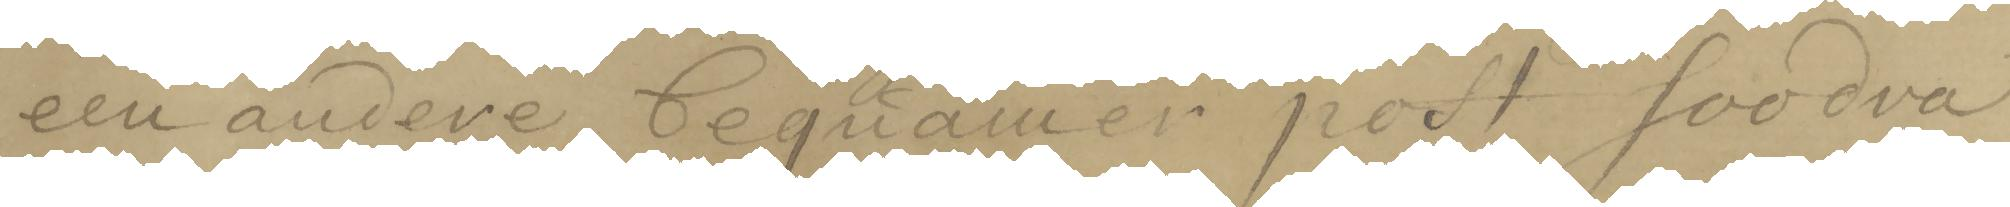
een andere bequamer post soodra
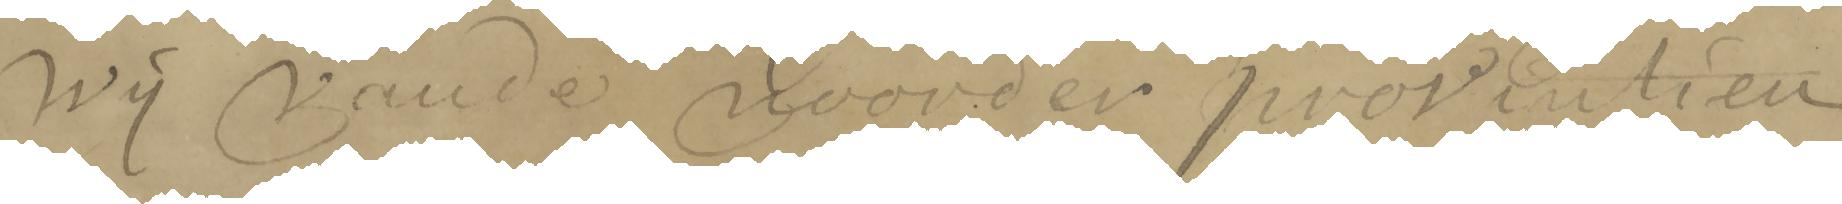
wij vande noorder provintien
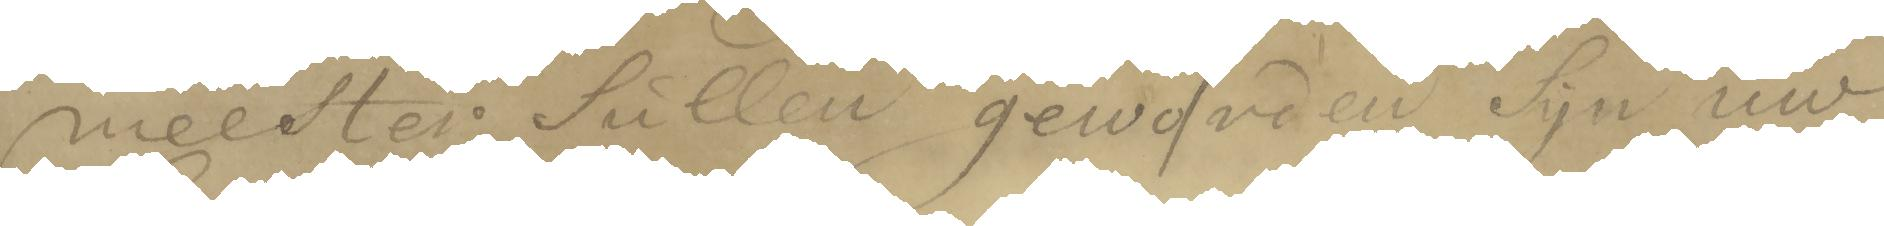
meester sullen geworden sijn uw
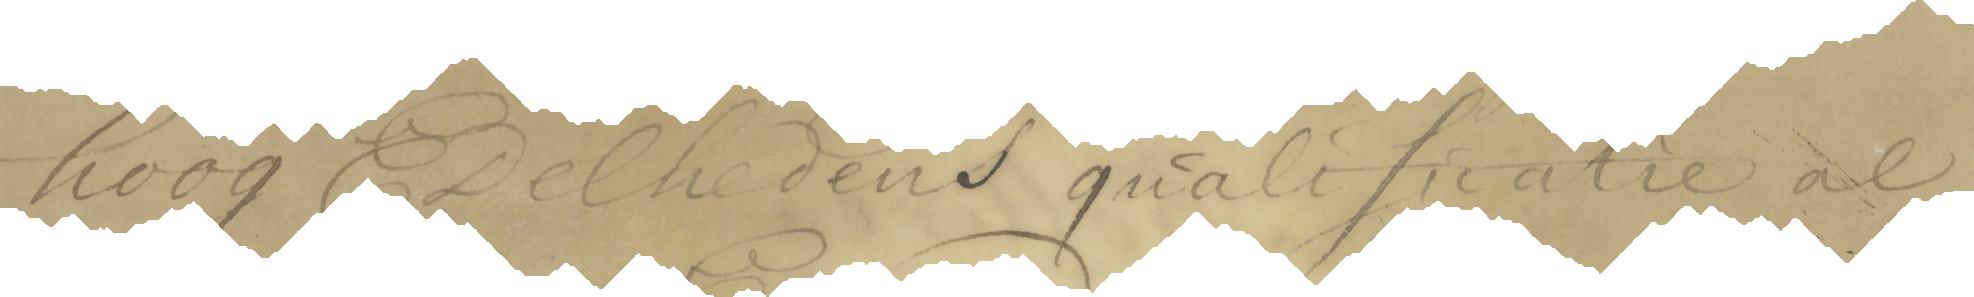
hoog EDelhedens qualificatie al
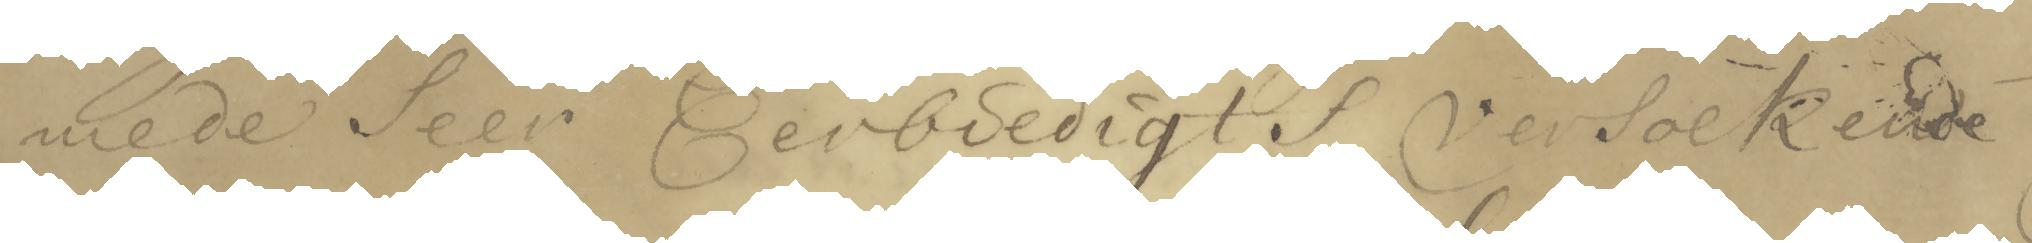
mede seer Eerbiedigts versoek ende
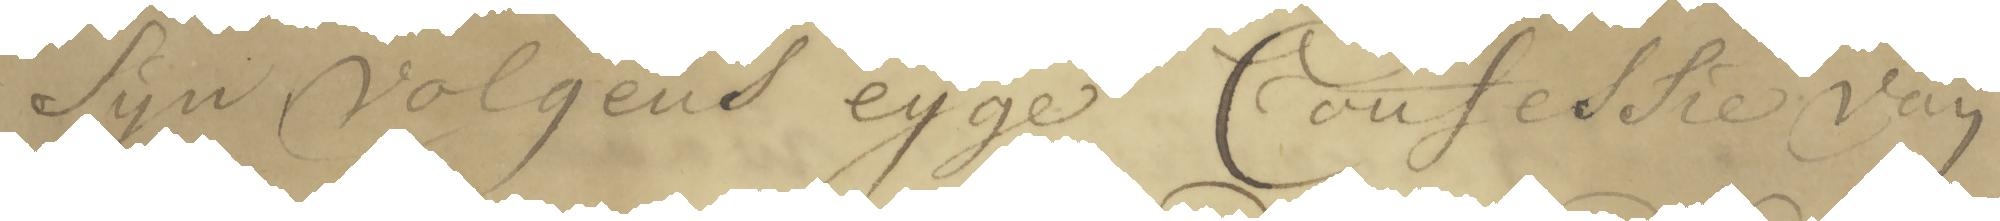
sijn volgens eijge Confessie van
